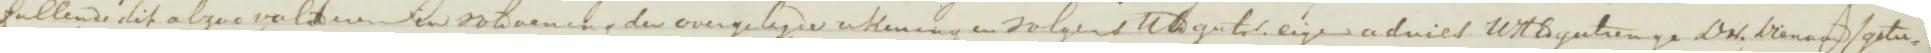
zullende dit alzoo valideren ter voldoening der overgelegde rekening en volgens UEd gestr. eigen advies UH Ed gestrenge Dw Dienaar / getee„
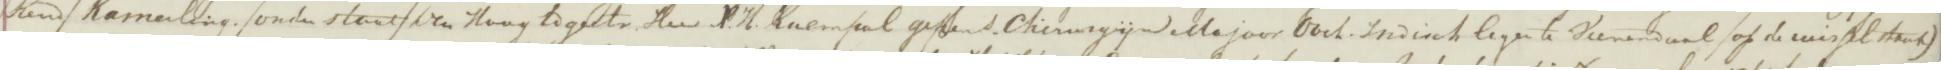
kend/ Kamerling. /onderstaat / DenHoog Ed gestr. Heer R:H. Ruempol gepens. Chirurgijn Majoor Oost. Indisch leger te Veenendaal /op de wissel staat)
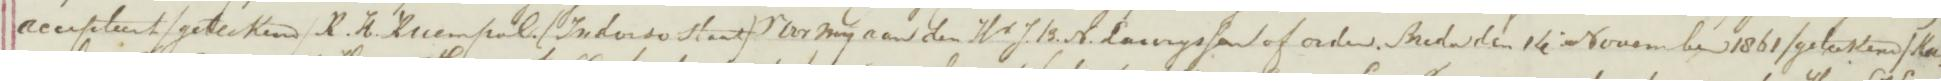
accepteert /geteekend/ R. H. Reumpol. (In dorso staat) Voor mij aan den H:r J.B.N. Lauryssen of order, Breda den 14 November 1861 /geteekend / Ka=
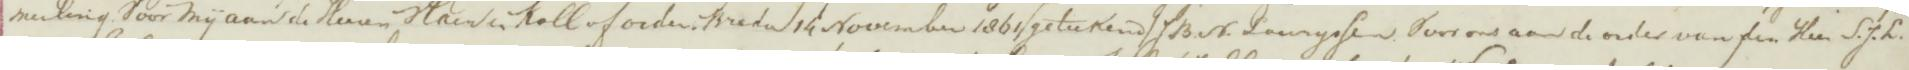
merling Voor Mij aan de Heeren Vlaer en Koll of order, Breda 14 November 1861/ geteekend/ J. B. N. Lauryssen, Voor ons aan de order van den Heer S.J.L.
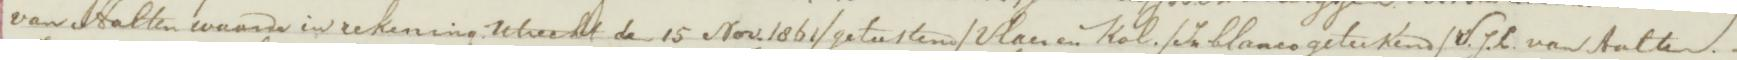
van Aalten waarde in rekening Utrecht den 15 Nov. 1861/ geteekend/ Vlaer en Kol. / In blanco geteekend/ S. J. L. van Aalten.
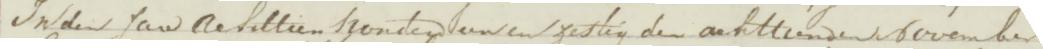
In den Jare Achttien Honderd een en zestig den achttienden November
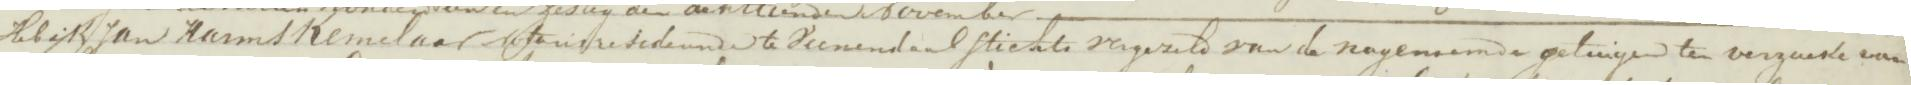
Heb ik Jan Harms Kemelaar notaris residerende te Veenendaal Stichts vergezeld van de nagenoemde getuigen ten verzoeke van
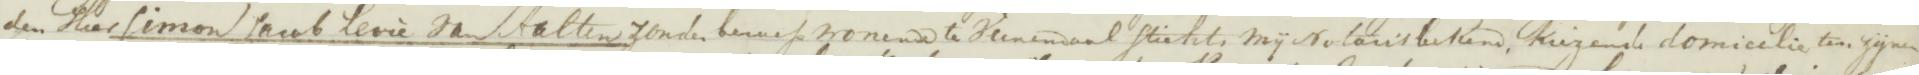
den Heer Simon Jacob Levie van Aalten zonder beroep wonende te Veenendaal Stichts, mij Notaris bekend, kiezende domicilie ten zijnen
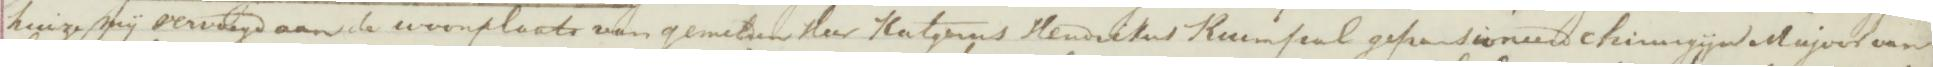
huize mij vervoegd aan de woonplaats van gemelden Heer Hatgerus Hendrikus Ruempol gepensioneerd chirurgijn Majoor van
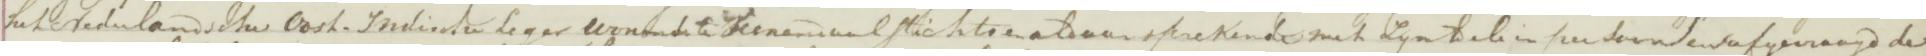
het Nederlandsche Oost- Indische Leger wonende te Veenendaal Stichts en aldaar sprekende met zijn Edele in persoon en afgevraagd de
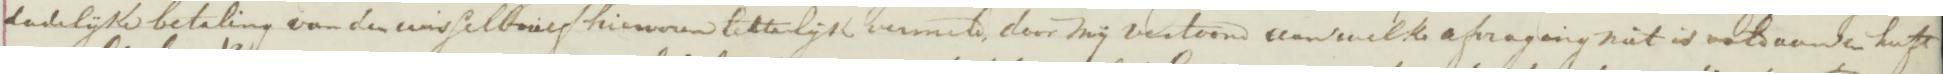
dadelijke betaling van den wisselbrief hiervoren letterlijk vermeld, door mij vertoond aan welke afvraging niet is voldaan en heeft
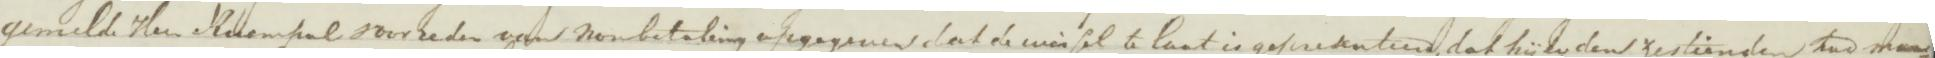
gemelde Heer Ruempol voor reden van nonbetaling opgegeven dat de wissel te laat is gepresenteerd, dat hij bij den zestienden had moet
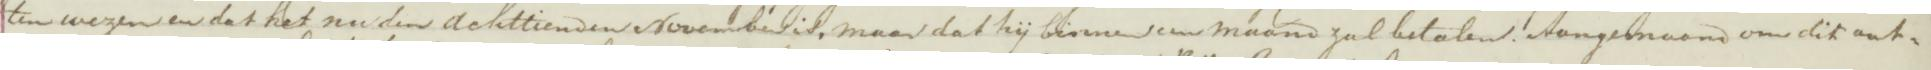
ten wezen en dat het nu den achttienden November is, maar dat hij binnen een maand zal betalen. Aangemaand om dit ant„
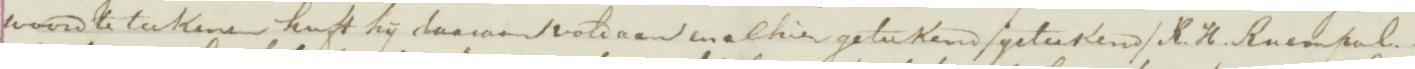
woord te teekenen heeft hij daaraan voldaan en alhier geteekend / geteekend/ R. H. Ruempol.
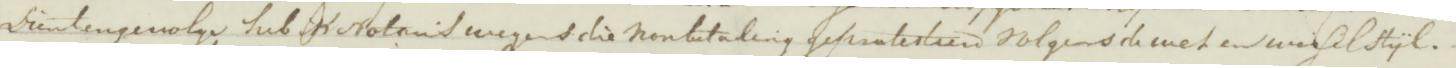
Dientengevolge heb ik Notaris wegens die nonbetaling geprotesteerd volgens de wet en wisselstijl.
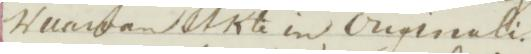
Waarvan Akte in Originali„
